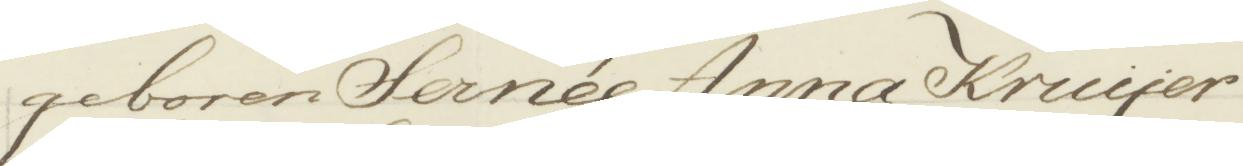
geboren Sernée, Anna Kruijer
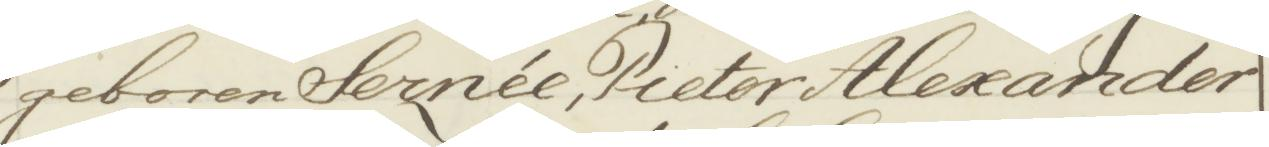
geboren Sernée, Pieter Alexander
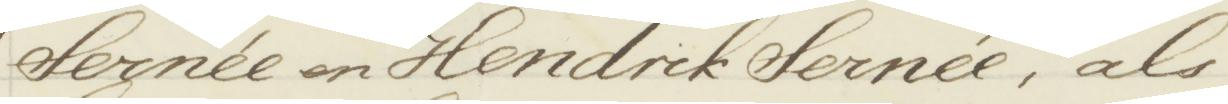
Sernée en Hendrik Sernée, als
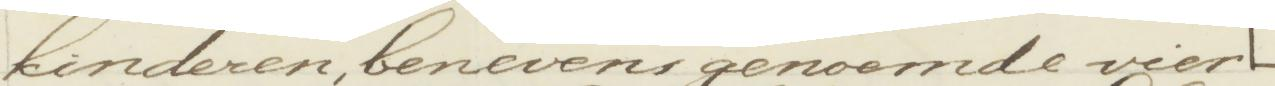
kinderen, benevens genoemde vier
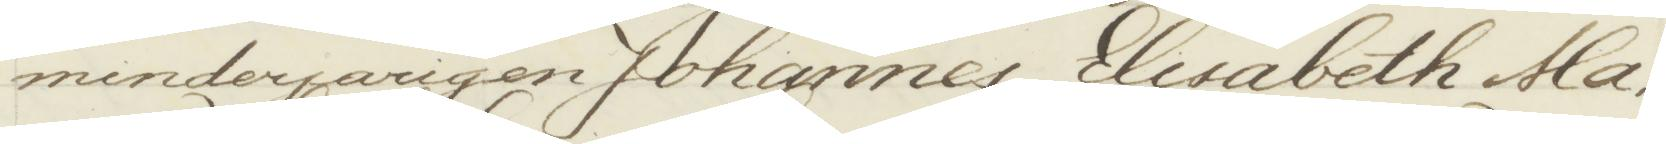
minderjarigen Johannes,- Elisabeth Ma„
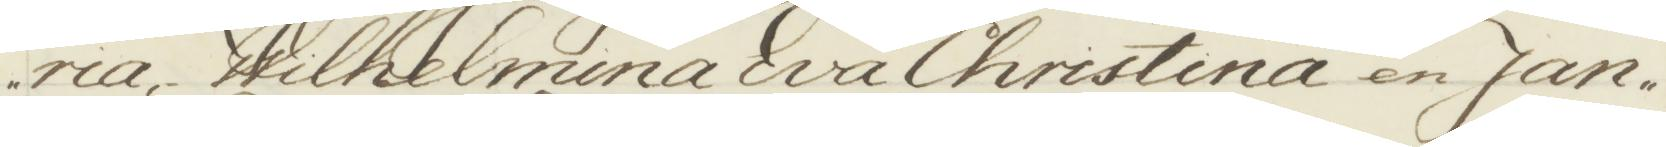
„ria,- Wilhelmina Eva Christina en Jan„
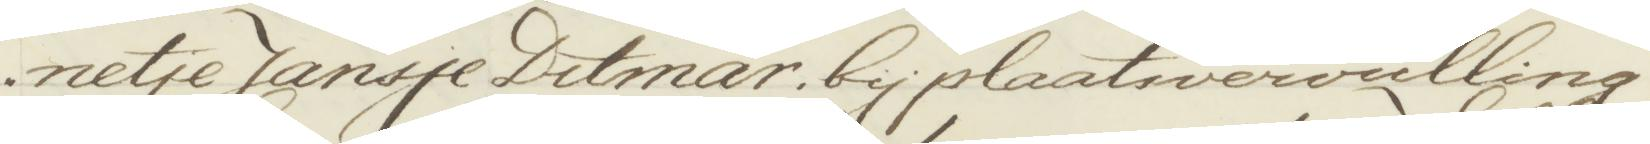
„netje Jansje Ditmar, bij plaatsvervulling
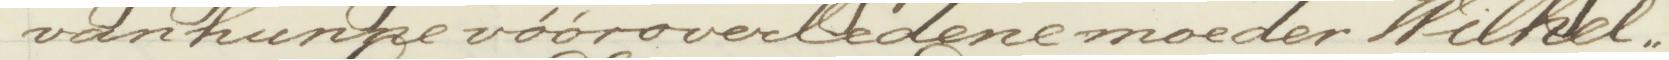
van hunne vóóroverledene moeder Wilhel„
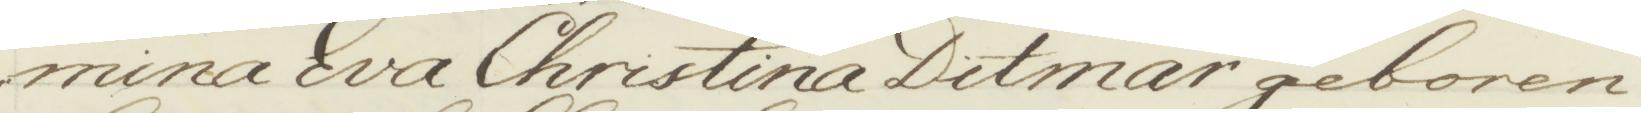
mina Eva Christina Ditmar geboren
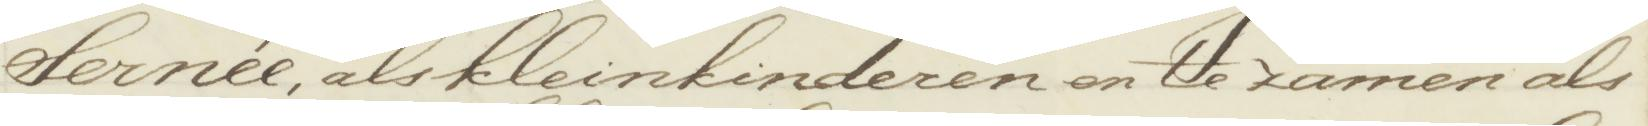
Sernée, als kleinkinderen en te zamen als
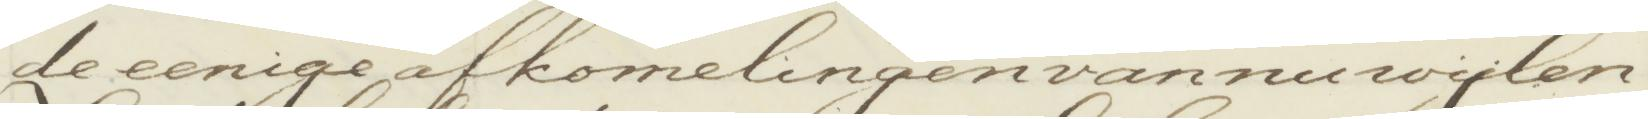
de eenige afkomelingen van nu wijlen
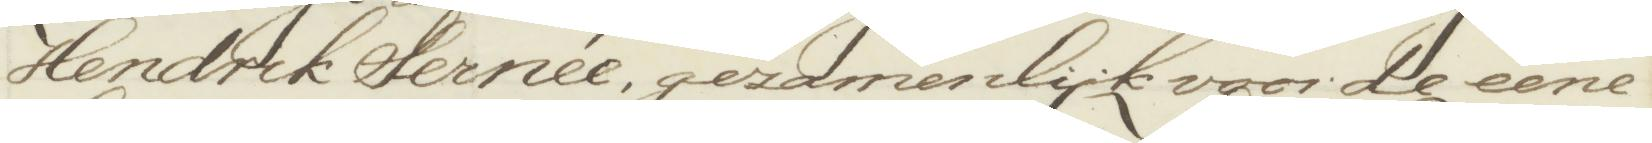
Hendrik Sernée, gezamenlijk voor de eene
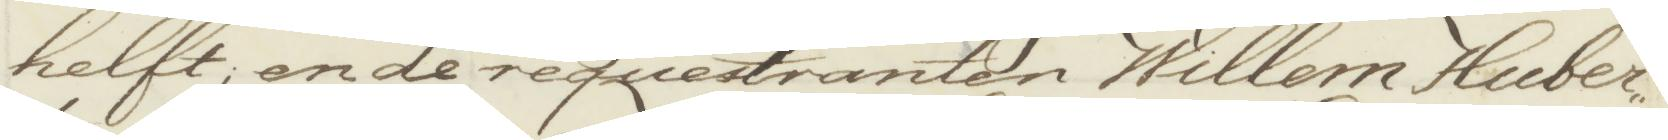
helft; en de requestranten Willem Huber
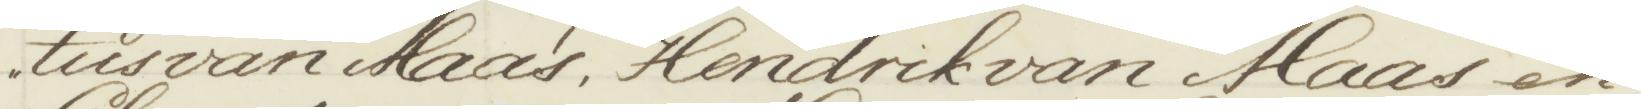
„tus van Maas, Hendrik van Maas en
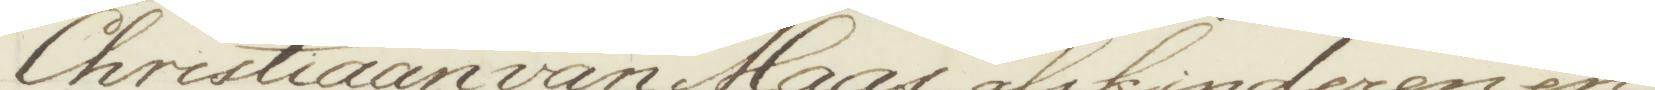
Christiaan van Maas, als kinderen en
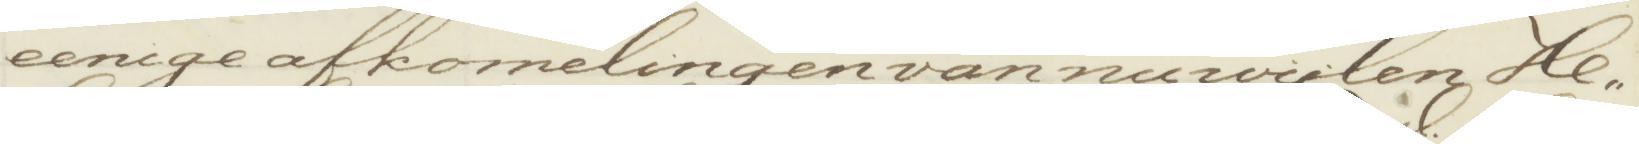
eenige afkomelingen van nu wijlen He„
